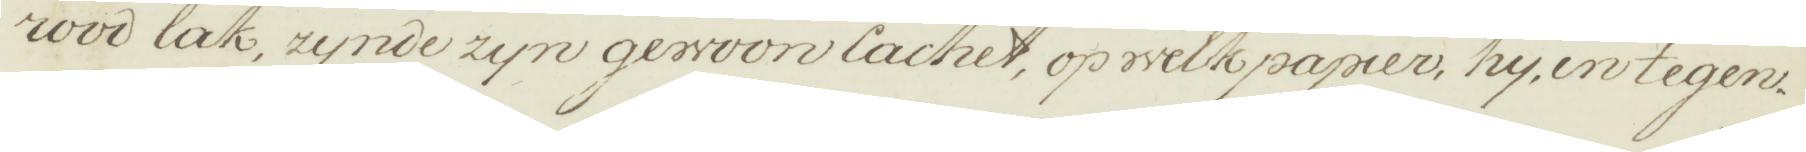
rood lak, zynde zyn gewoon Cachet, op welk papier, hy, in tegen„
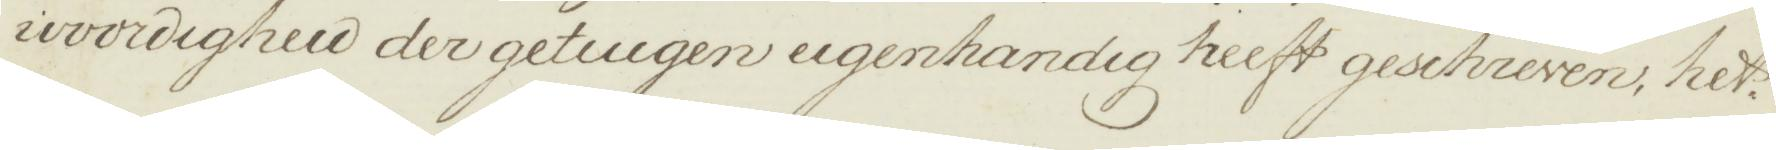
woordigheid der getuigen eigenhandig heeft geschreven, het„
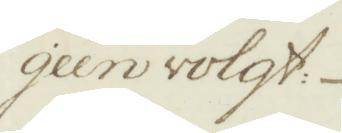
geen volgt: -
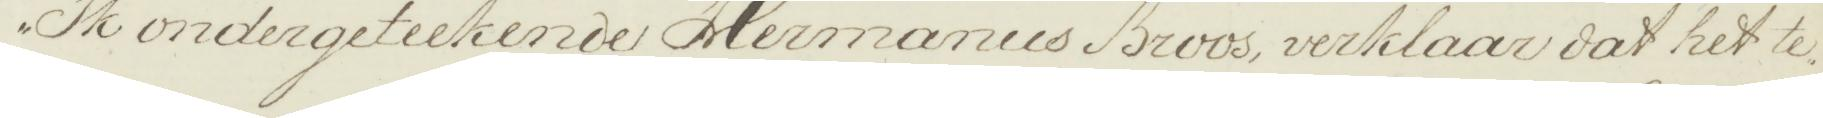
„Ik ondergeteekende Hermanus Broos, verklaar dat het te
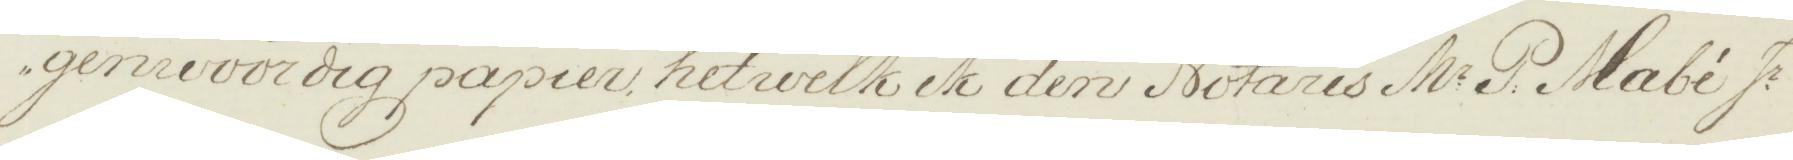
„genwoordig papier, het welk ik den Notaris M:r P: Mabé J.r
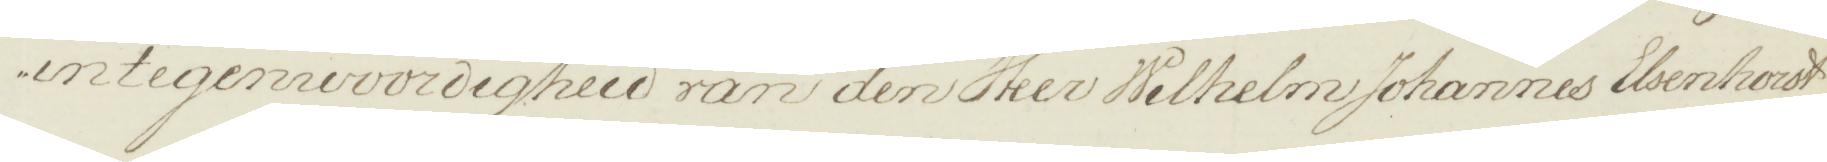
„integenwoordigheid van den Heer Wilhelm Johannes Elsenhorst
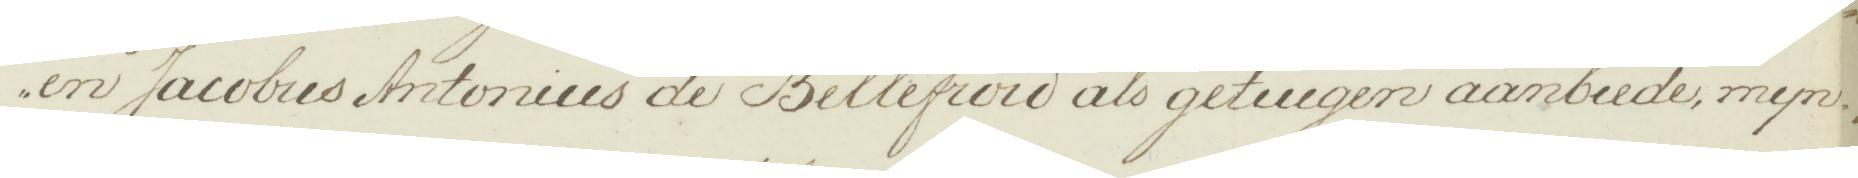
„en Jacobus Antonius de Bellefroid als getuigen aanbiede, myn
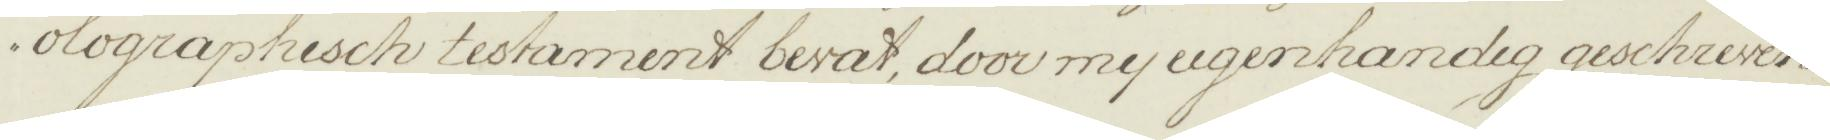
„olographisch testament bevat, door mij eigenhandig geschreven
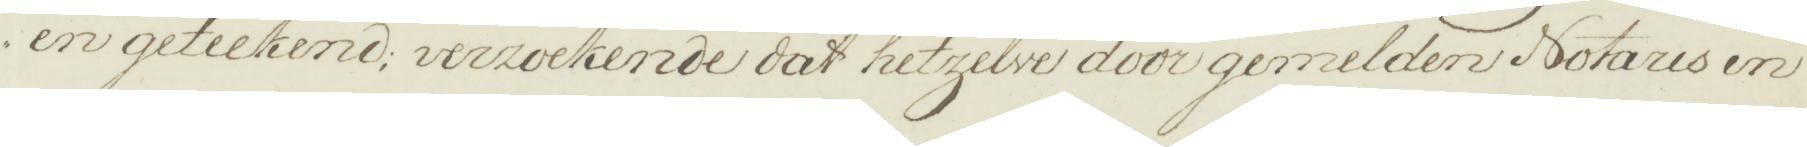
en geteekend; verzoekende dat hetzelve door gemelden Notaris in
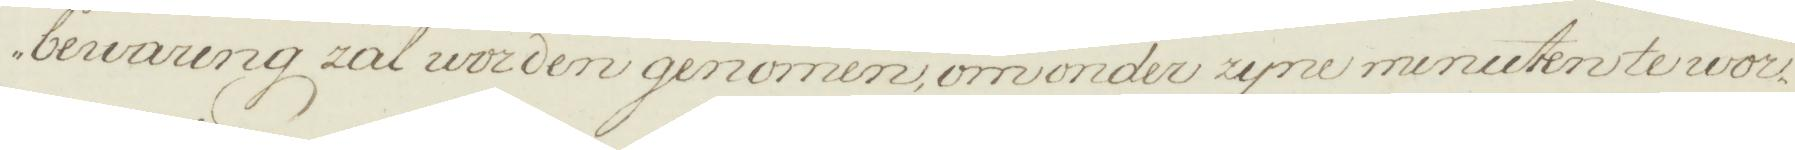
„bewaring zal worden genomen, om onder zyne minuten te wor
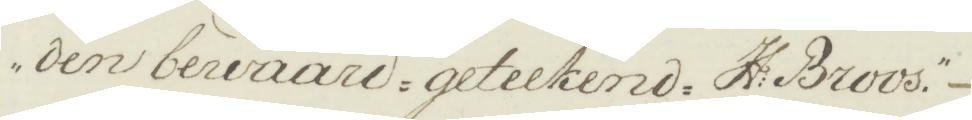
„den bewaard = geteekend= H: Broos." -
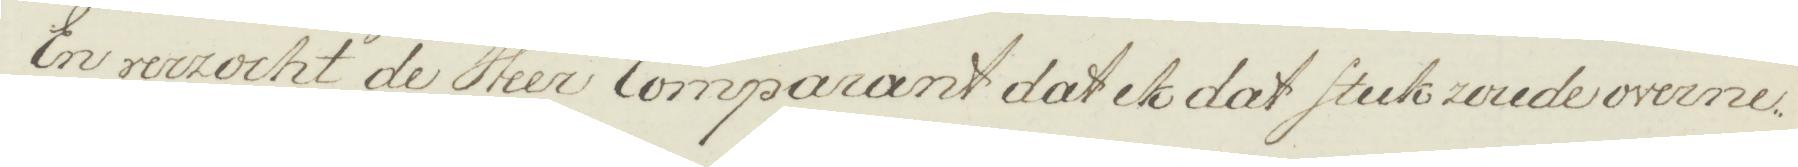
En verzocht de Heer Comparant dat ik dat stuk zoude overne„
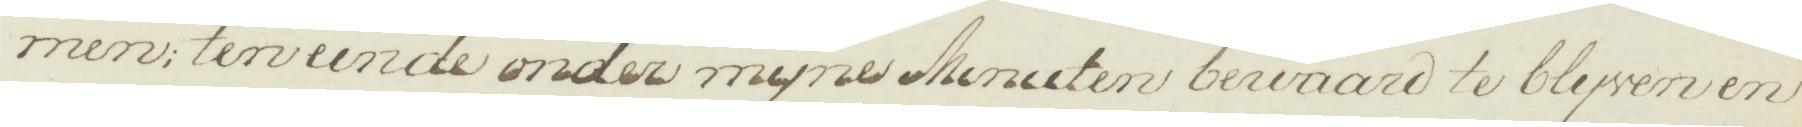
men; ten einde onder myne Minuten bewaard te blyven en
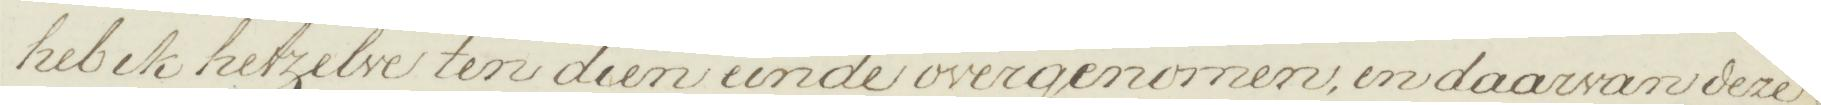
heb ik hetzelve ten dien einde overgenomen, en daarvan deze
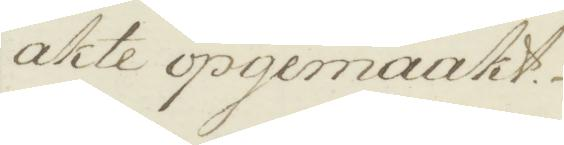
akte opgemaakt.
